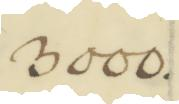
3000.
